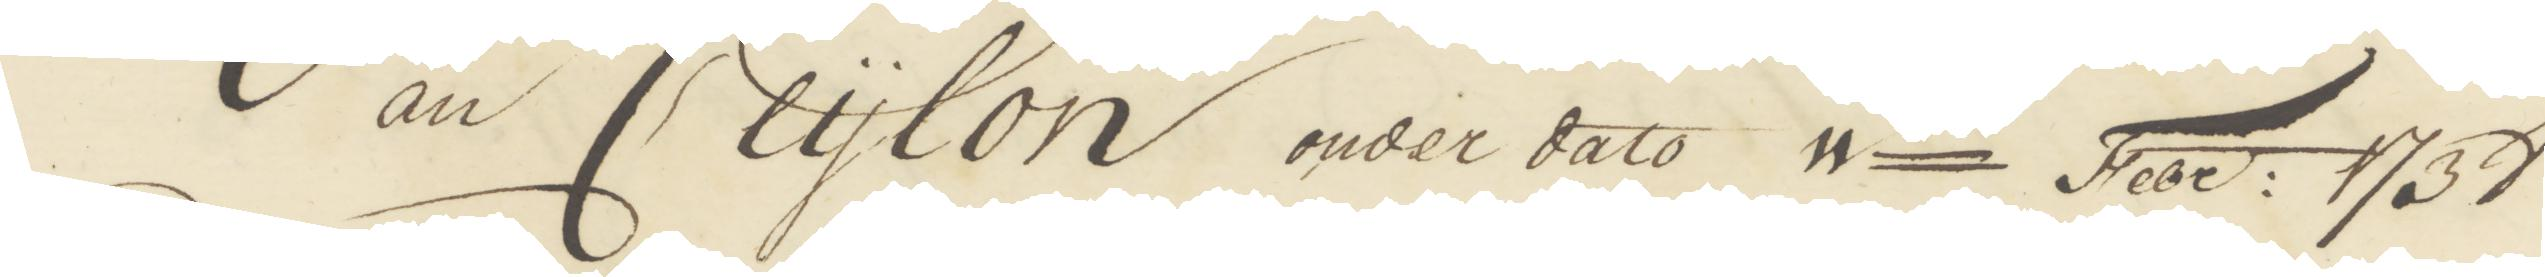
Van Ceijlon onder dato 11'= Febr: 1738
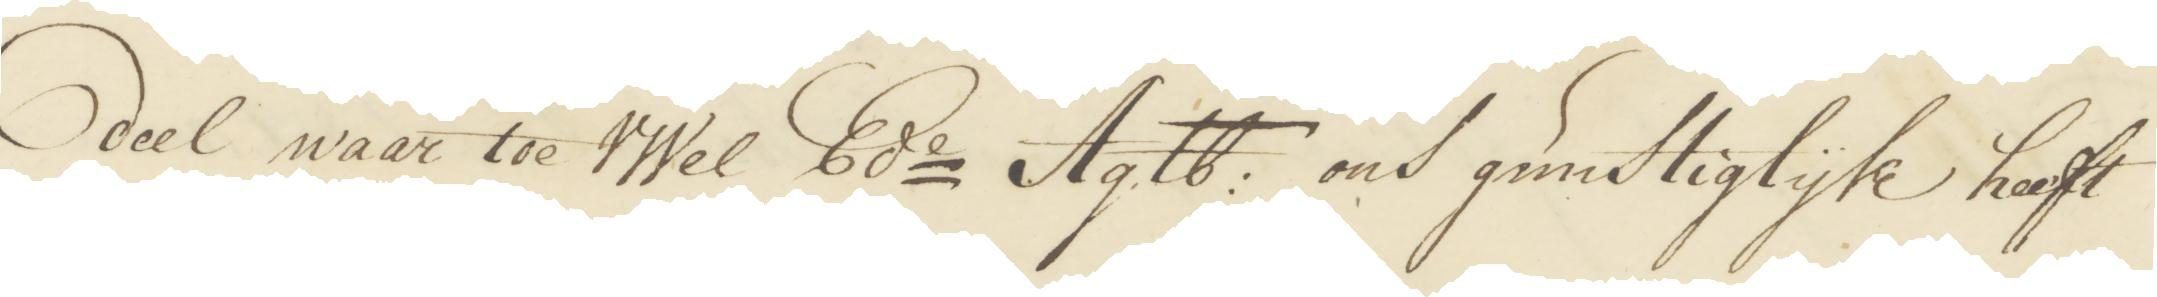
deel waar toe VWel Ed=e Agtb: ons gunstiglijk heeft
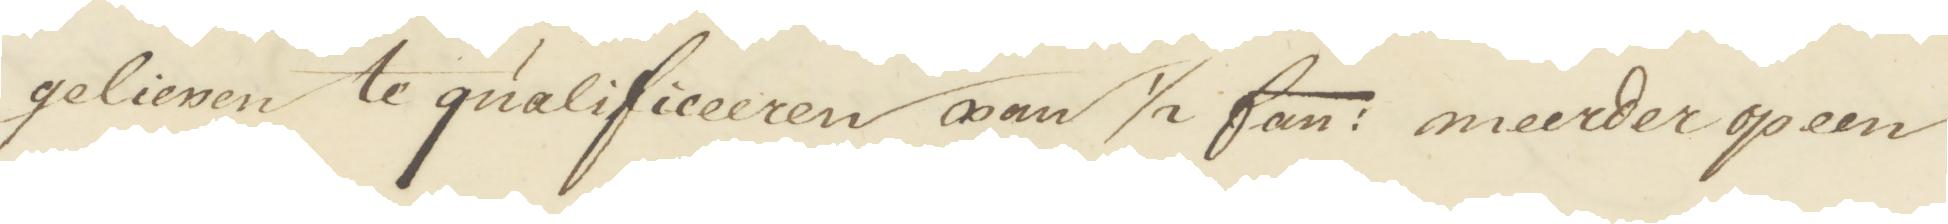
gelieven te qualificeeren van ½ fan: meerder op een
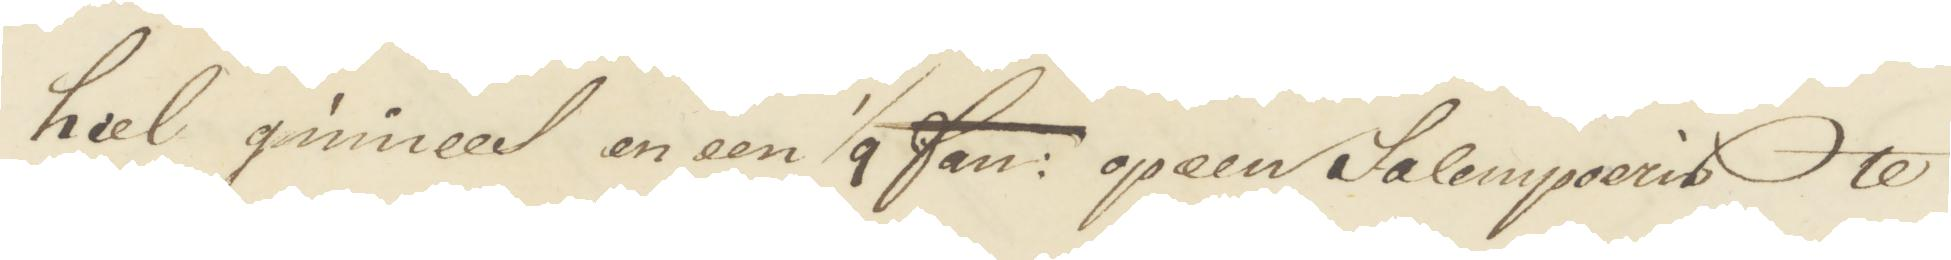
heel guinees en een ¼ fan: op een Salempoeris te
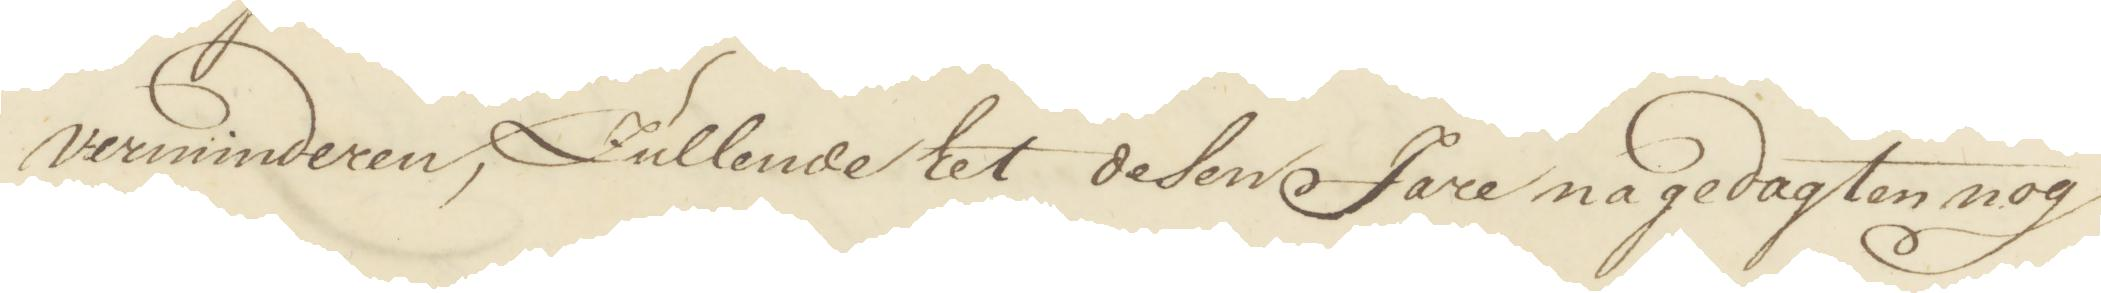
verminderen, zullende het desen Jare nagedagten nog
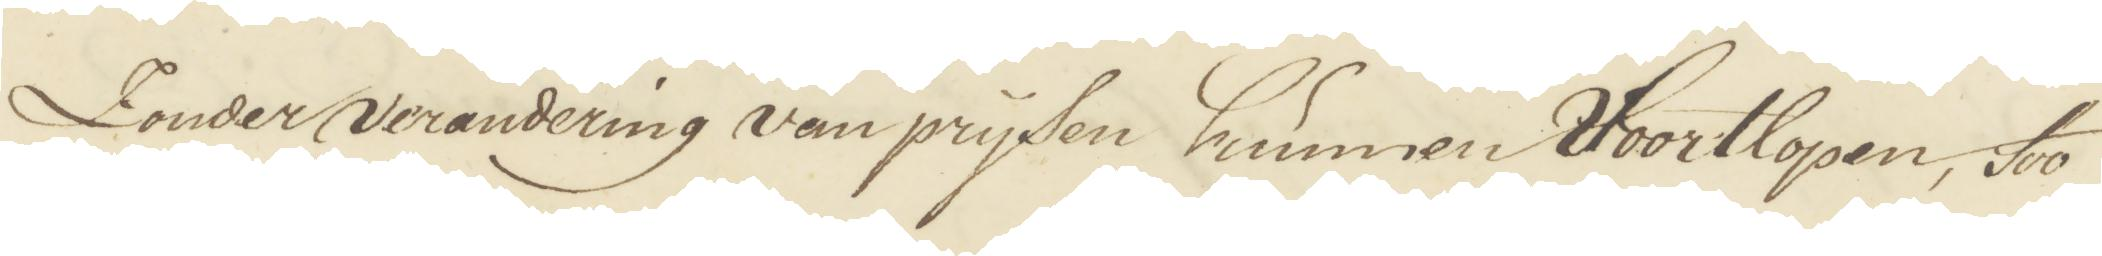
zonder verandering van prijsen kunnen Voortlopen, soo
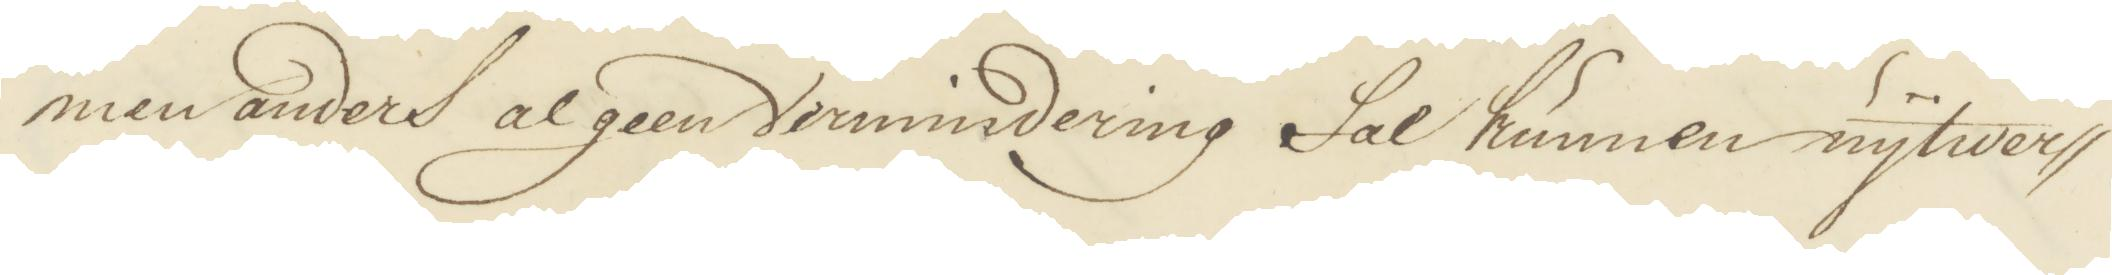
men anders al geen Vermindering sal kunnen uijtwer„
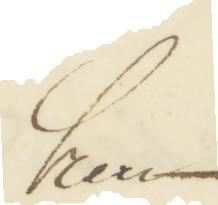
ken—
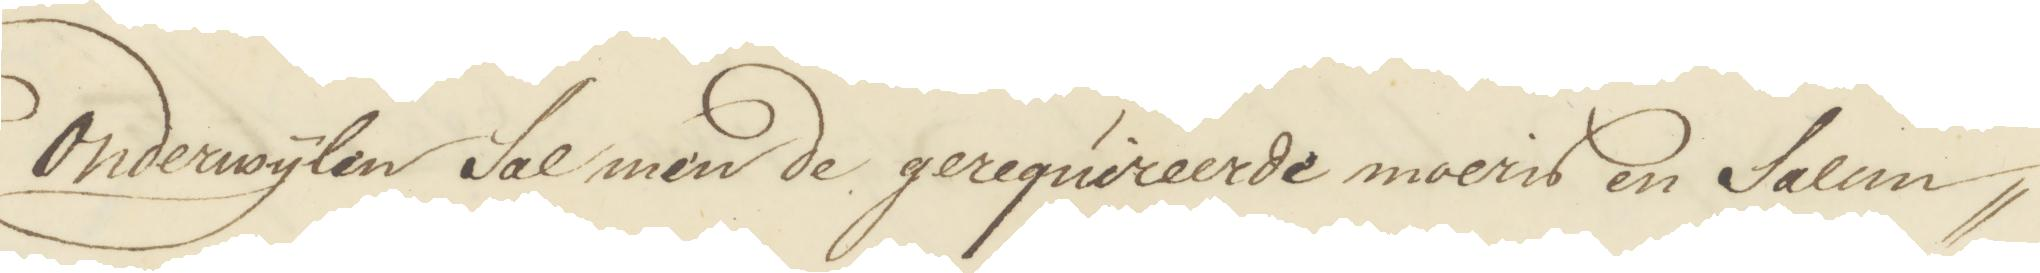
Onderwijlen sal men de gerequireerde moeris en salem„
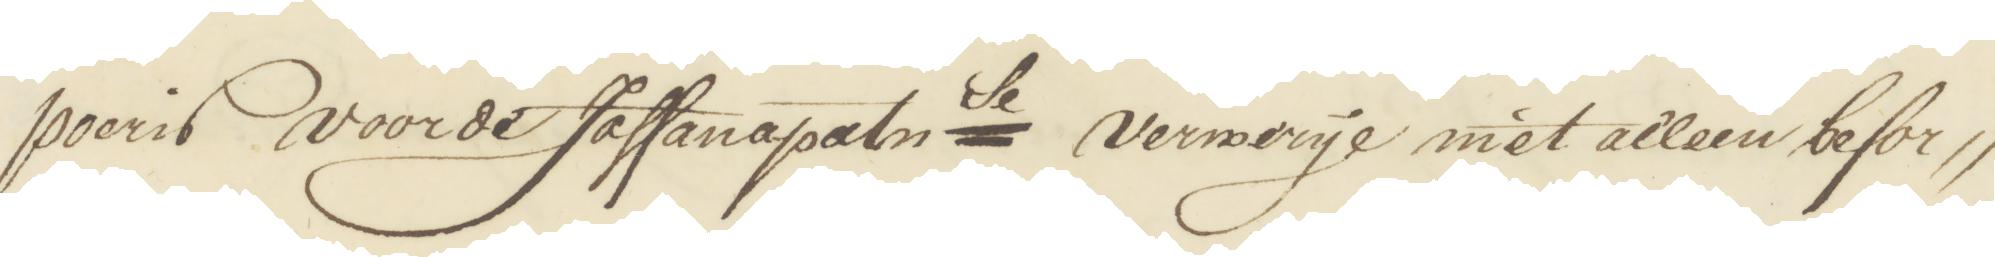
poeris voor de Jaffanapatn=se verwerije met alleen besor„
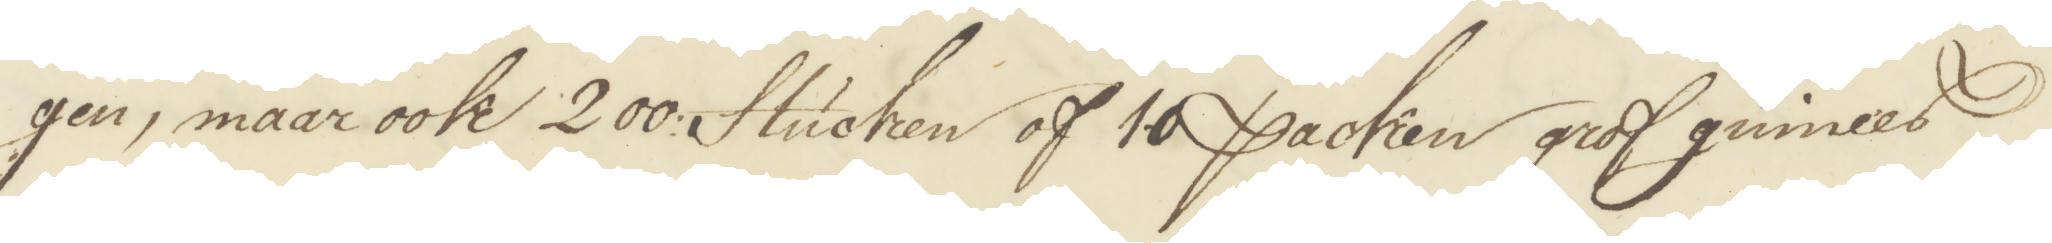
gen, maar ook 200: stucken of 10 packen grof guinees
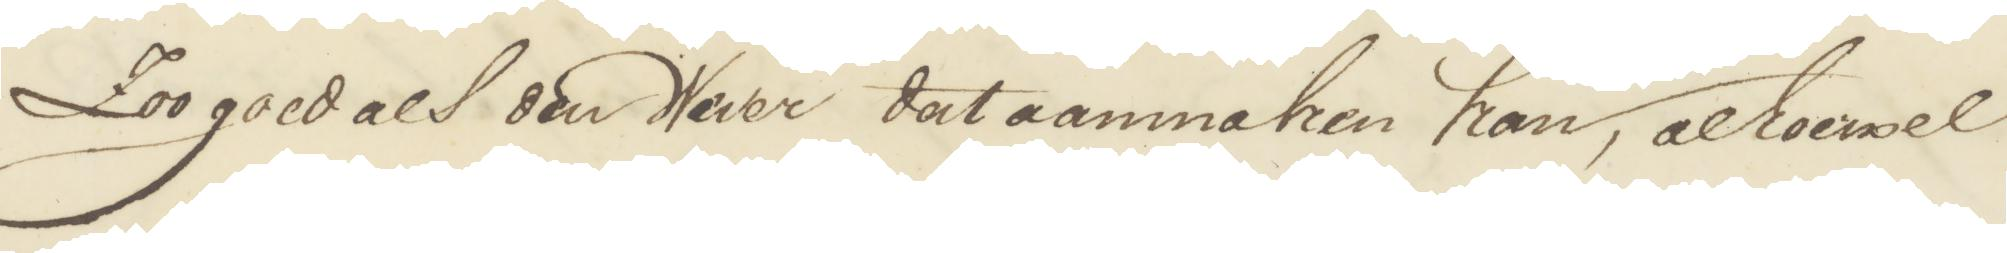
zoo goed als den Wever dat aanmaken kan, alhoewel
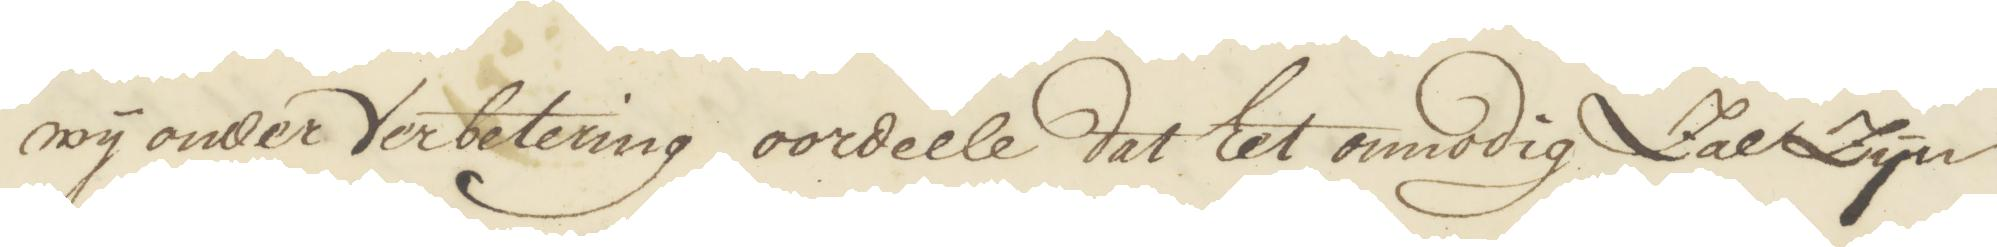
wij onder Verbetering oordeele dat het onnodig zal zijn
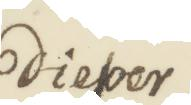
dieper
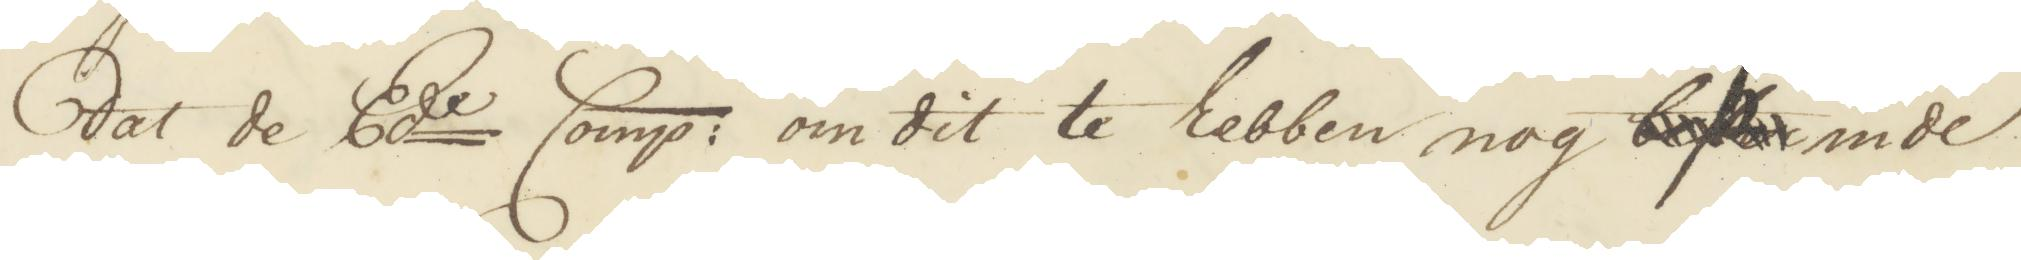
dat de Ed=e Comp: om dit te hebben nog beter in de
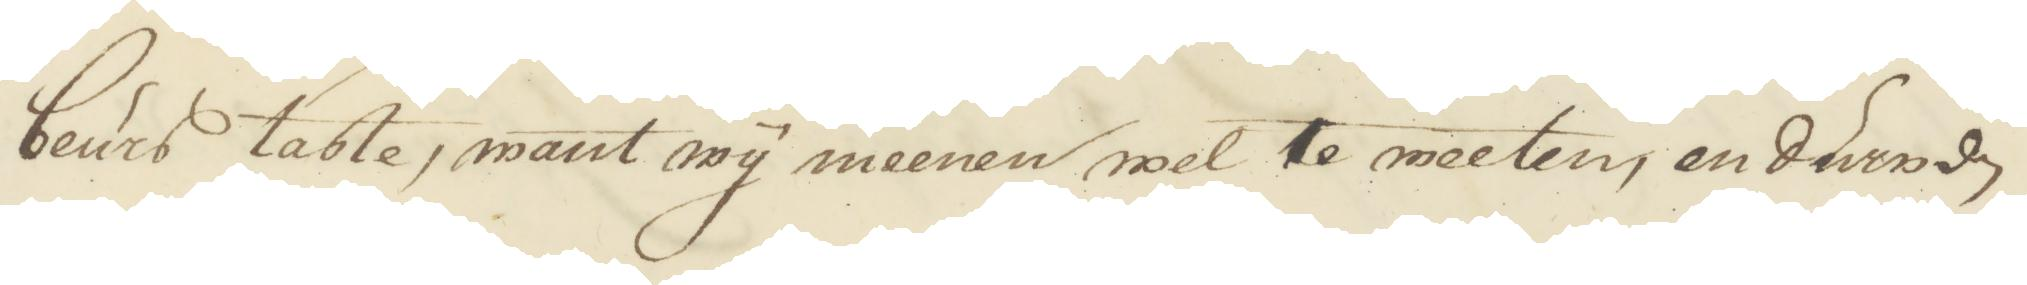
beurs laste, want wij meenen wel te weeten, en durven
